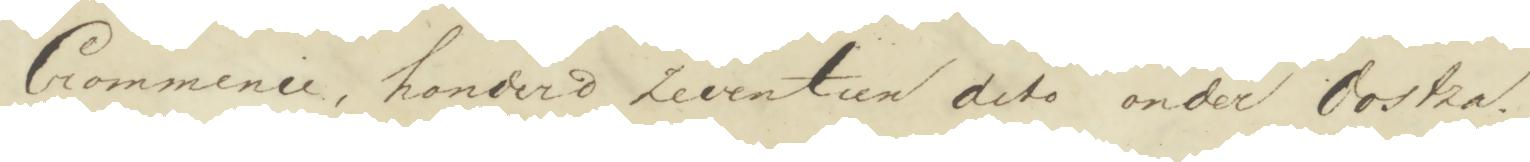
Crommenie, honderd zeventien dito onder Oostza„
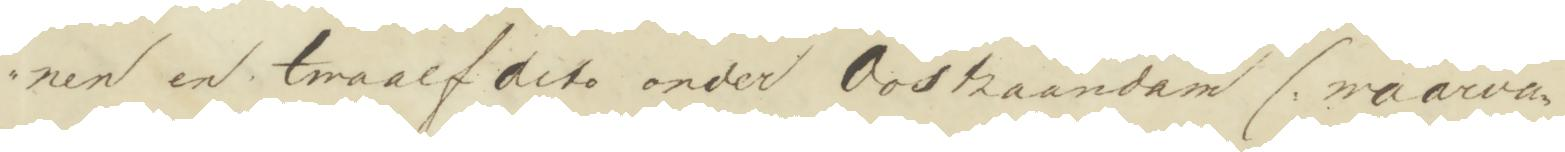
„nen en twaalf dito onder Oostzaandam (.waarvan
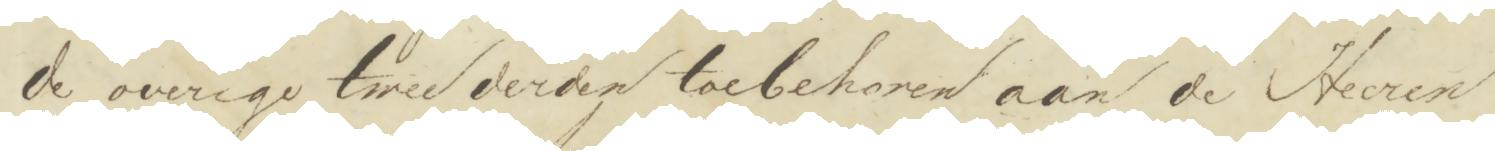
de overige twee derden toebehoren aan de Heeren
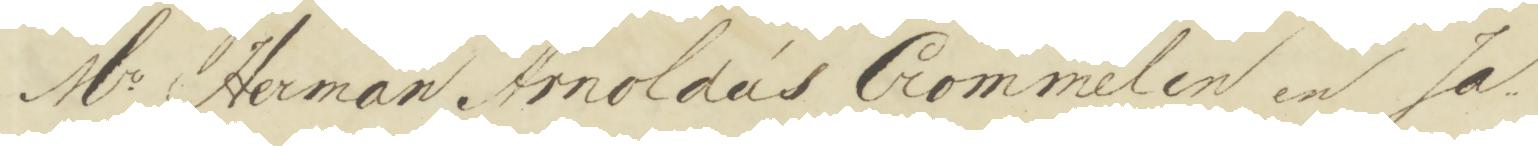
M.r Herman Arnoldus Crommelin en Ja„
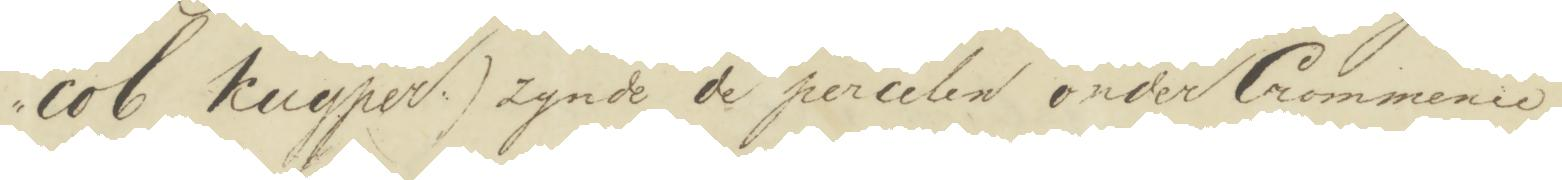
„cob Kuyper:) zynde de percelen onder Crommenie
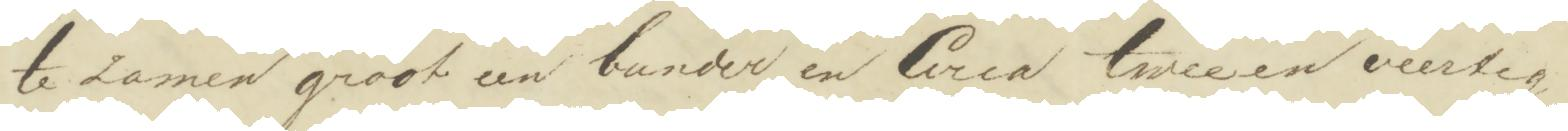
te zamen groot een bunder en Circa twee en veertig
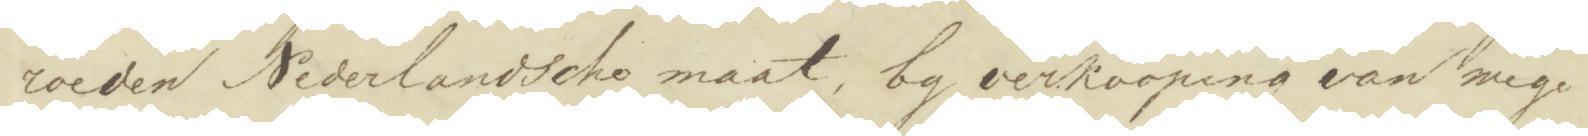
roeden Nederlandsche maat, by verkooping van wege
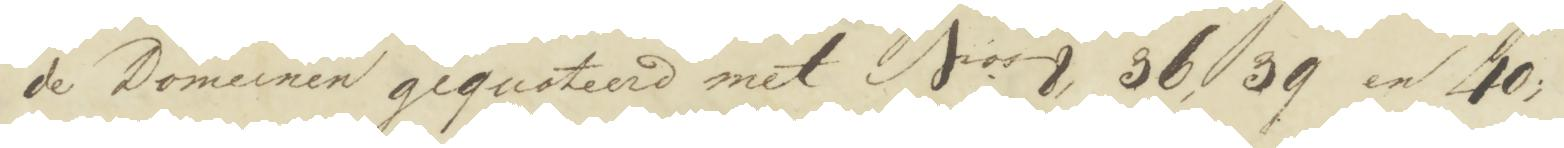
de Domeinen gequoteerd met N.os 8, 36, 39 en 40;
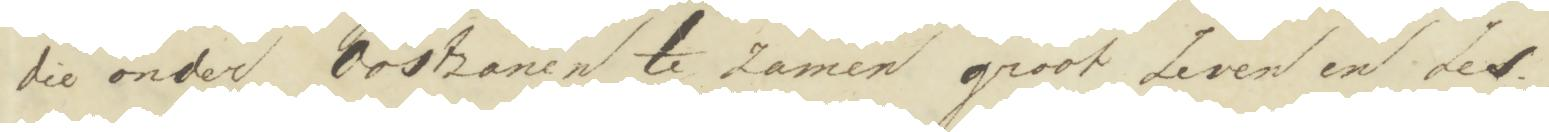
die onder Oostzanen te zamen groot zeven en zes„
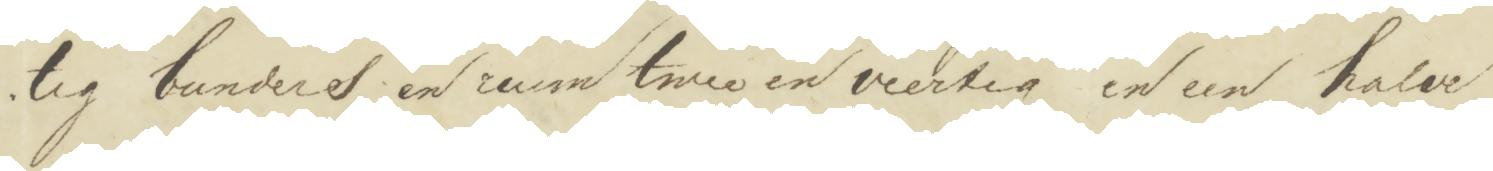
„tig bunders en ruim twee en veertig en een halve
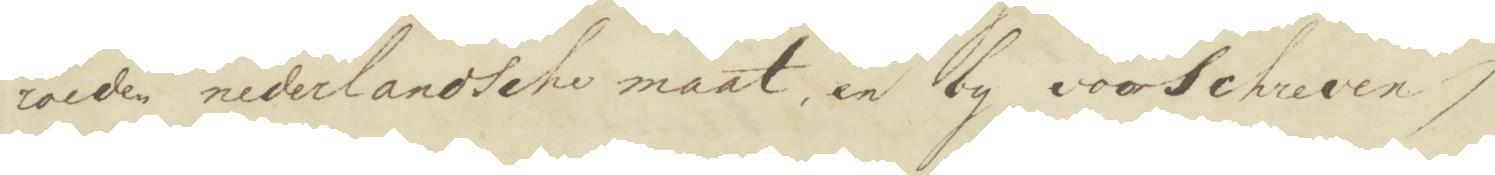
roeden nederlandsche maat, en by voorschreven
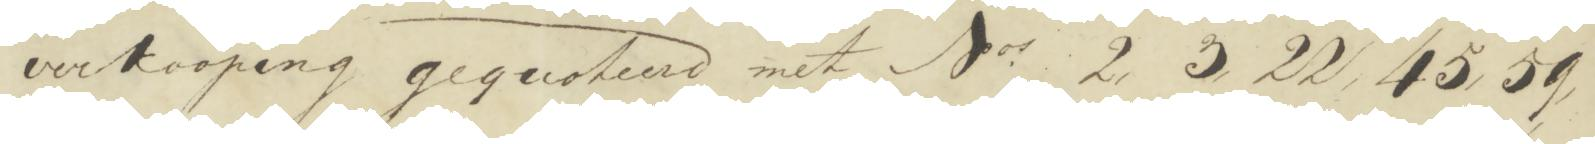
verkooping gequoteerd met N.os 2, 3, 22, 45, 59,
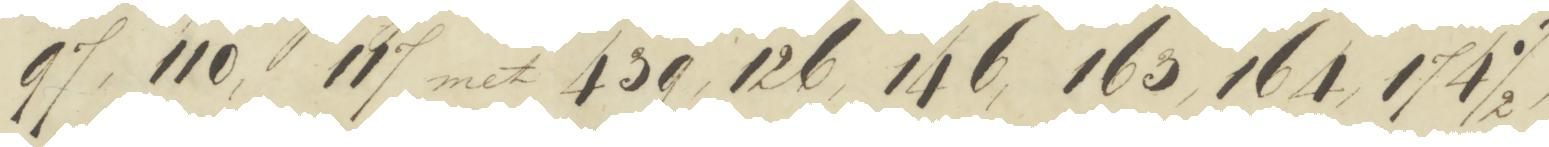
97, 110, 117 met 439, 126, 146, 163, 164, 174½,
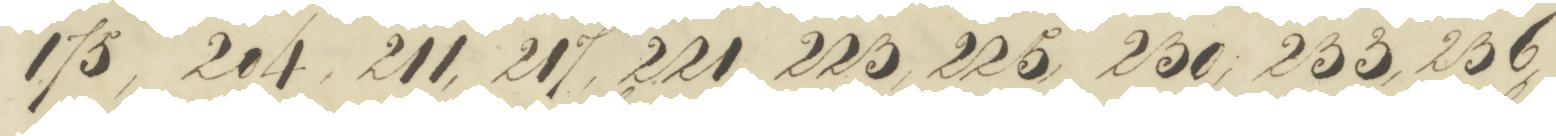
175, 204, 211, 217, 221, 223, 225, 230, 233, 236,
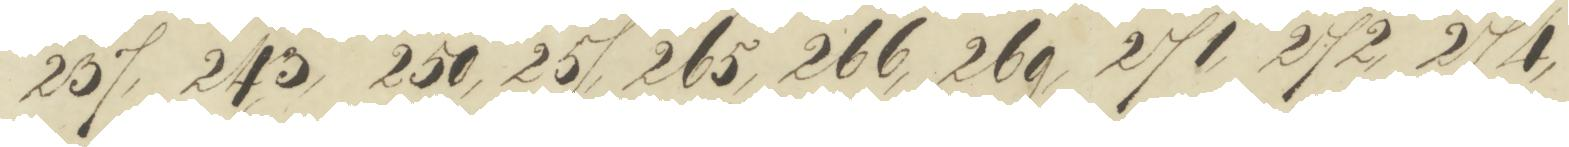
237, 243, 250, 257, 265, 266, 269, 271, 272, 274,
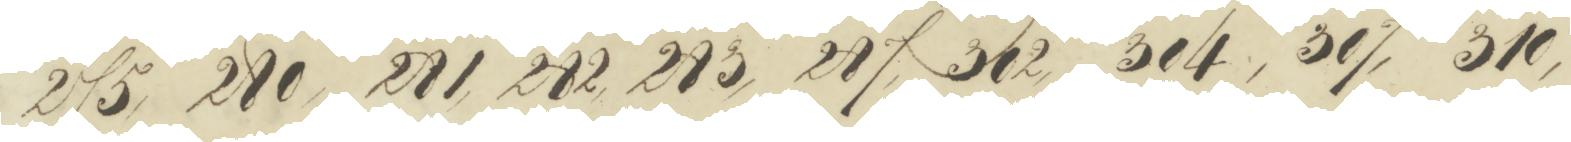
275, 280, 281, 282, 283, 287, 302, 304, 307, 310,
